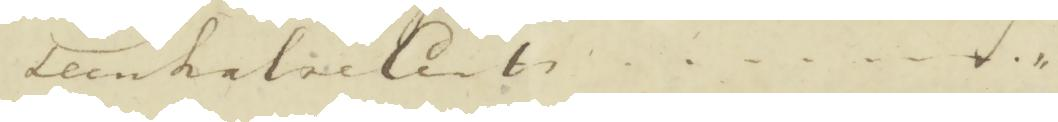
& een halve Cents - - - - - - - „
